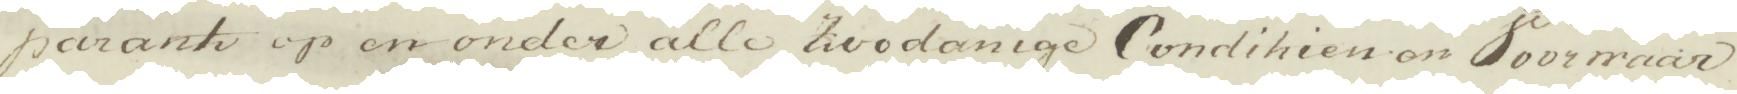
parant op en onder alle Zoodanige Conditien en Voorwaar
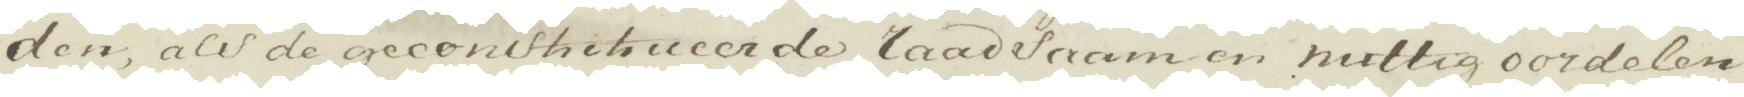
den, als de geconstitueerde Raadsaam en nuttig oordelen
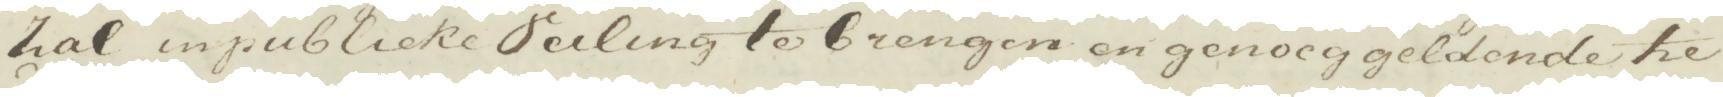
Zal in publieke Veiling te brengen en genoeg geldende te
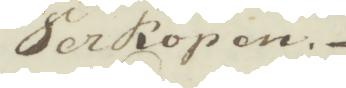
Verkopen.
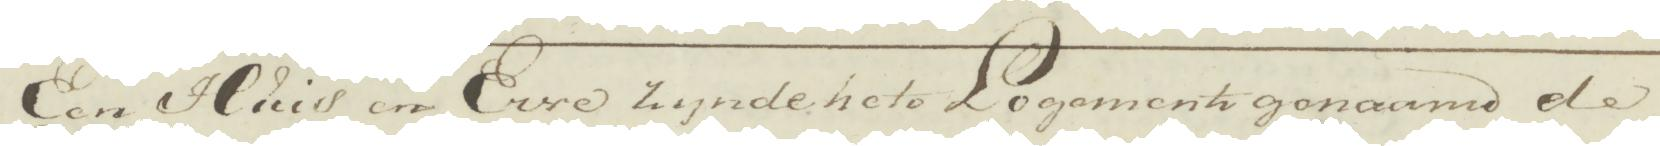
Een Huis en Erve zynde het Logement genaamd de
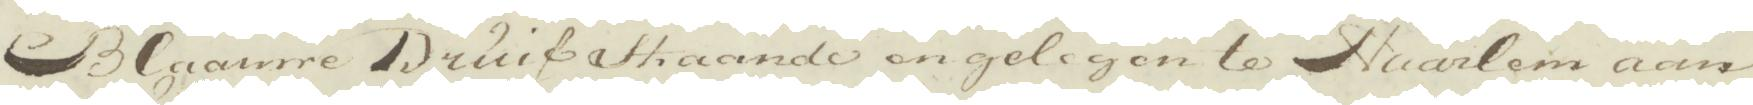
Blaauwe Druif Staande en gelegen te Haarlem aan
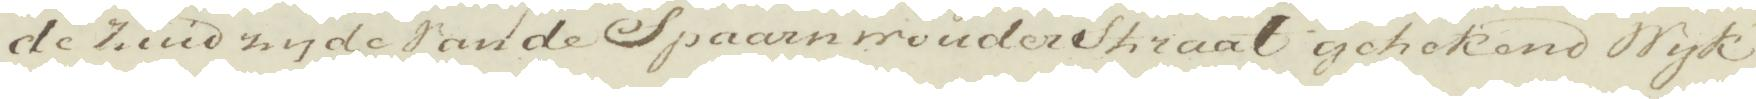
de Zuidzyde van de Spaarnwouderstraat getekend Wyk
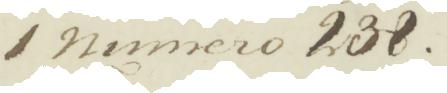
1 numero 238.
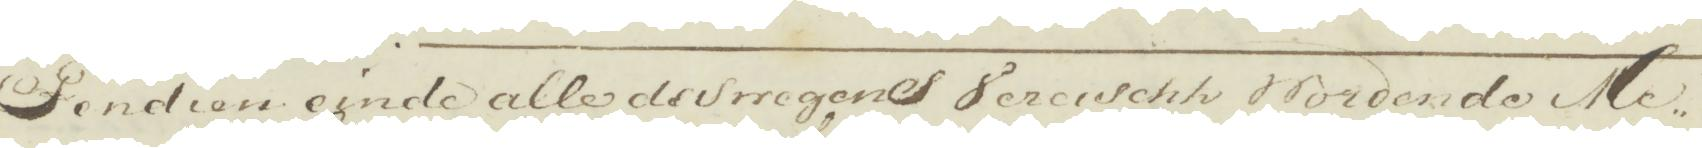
Ten dien einde alle deswegens vereischt worden de Me:
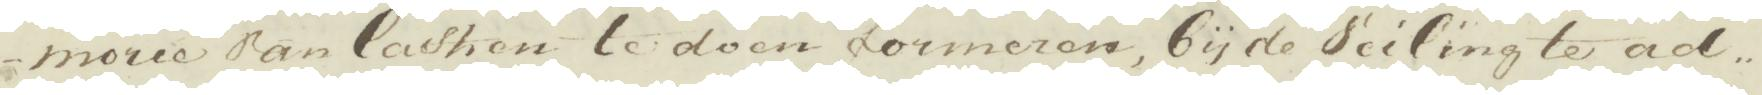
=morie van lasten te doen formeren, bij de Veiling te ad„
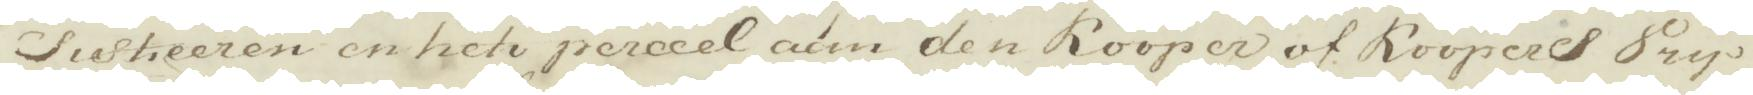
sisteeren en het perceel aan den Kooper of Koopers Vry
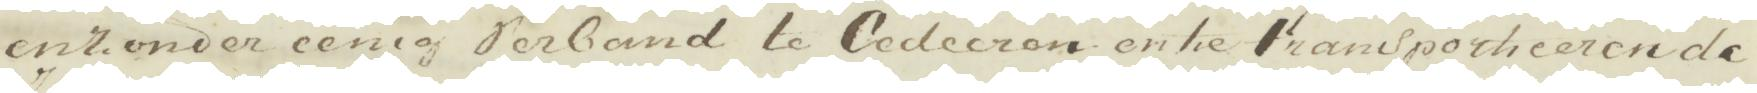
en zonder eenig verband te Cedeeren en te transporteeren de
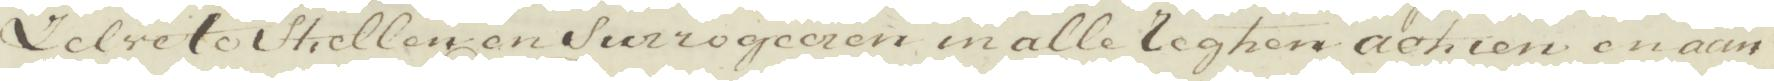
zelve te stellen en surrogeeren in alle regten actien en aan
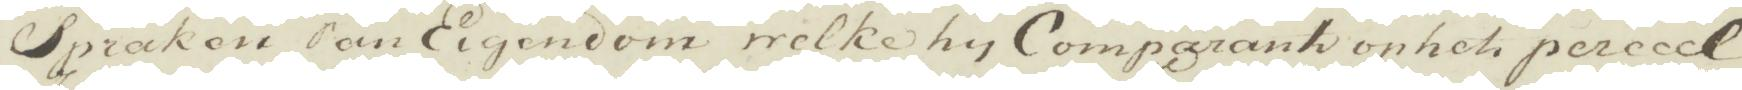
Spraken van Eigendom welke hy Comparant op het perceel
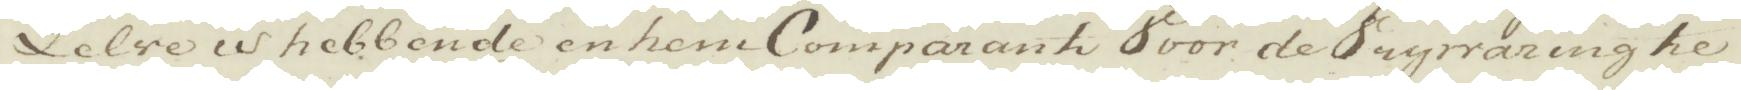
Zelve is hebbende en hem Comparant Voor de Vrywaring te
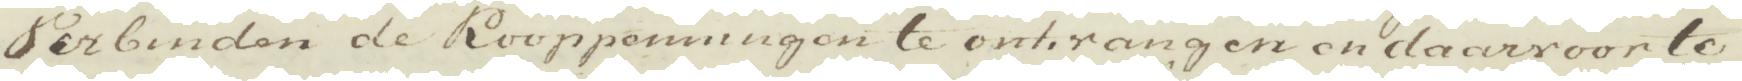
Verbinden de Kooppenningen te ontvangen en daarvoor te
